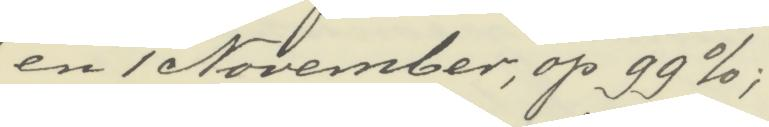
en 1 November, op 99 %;
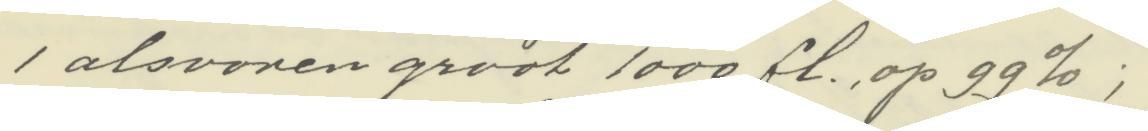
1 alsvoren groot 1000 fl., op 99% ;
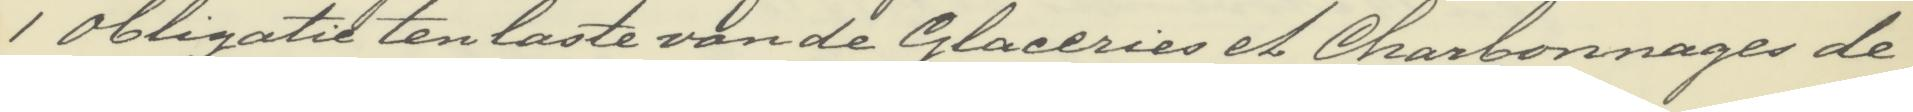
1 obligatie ten laste van de Glaceries et Charbonnages de
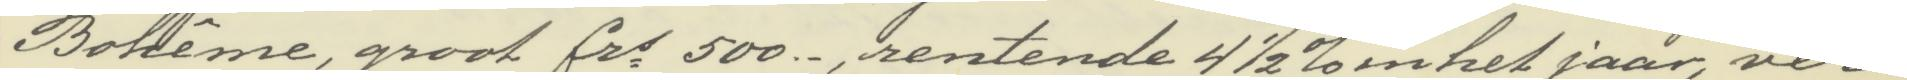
Bohême, groot fr:s 500.-, rentende 4½% in het jaar, ver=
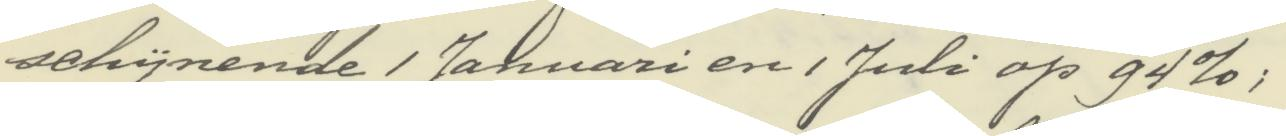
schijnende 1 Januari en 1 Juli op 94%;
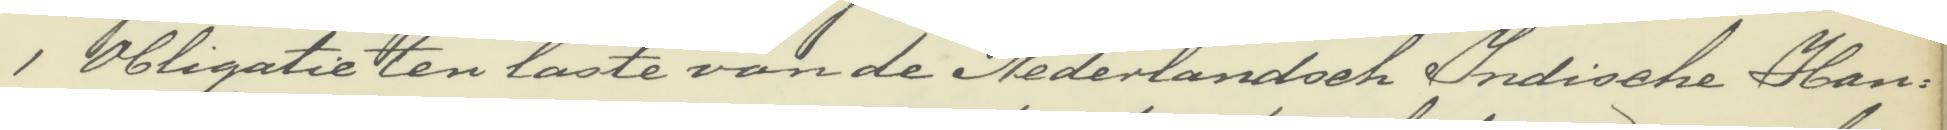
1 obligatie ten laste van de Nederlandsch Indische Han„
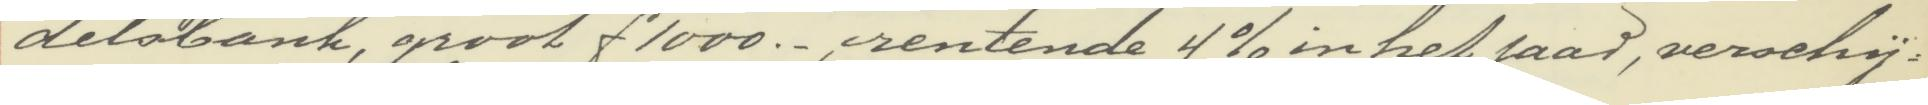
delsbank, groot ƒ 1000. - „rentende 4% in het jaar, verschij=
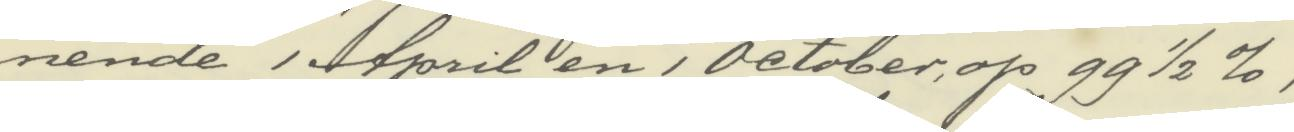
nende 1 April en 1 October, op 99½ %
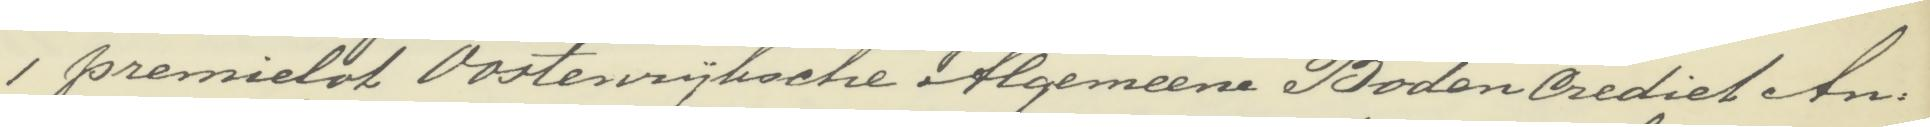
1 premielot Oostenrijksche Algemeene Boden Crediet An=
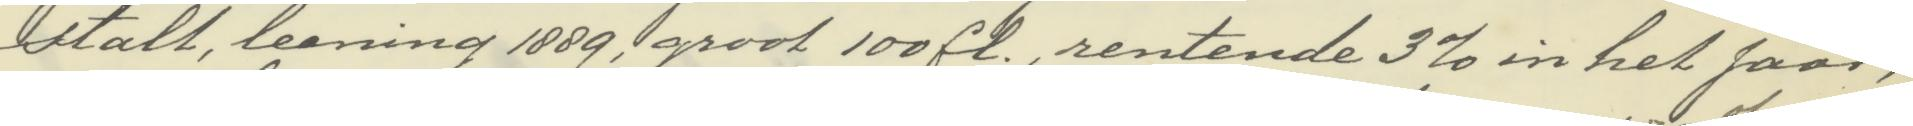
stalt, leening 1889, groot 100 fl., rentende 3% in het Jaar,
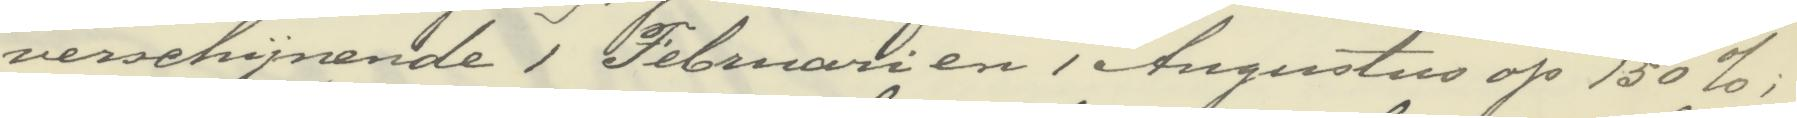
verschijnende 1 Februari en 1 Augustus op 150%;
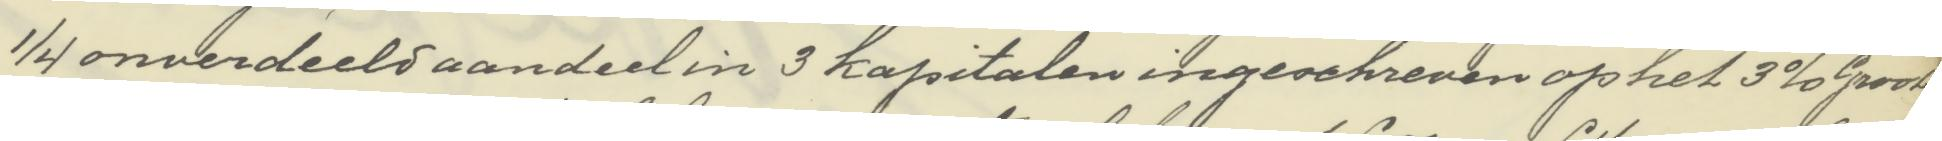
¼ onverdeeld aandeel in 3 kapitalen ingeschreven op het 3% Groot=
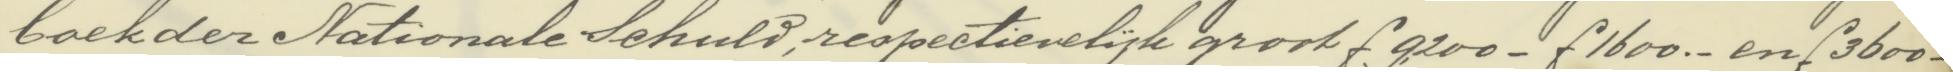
boek der Nationale Schuld, respectievelijk groot ƒ 9200 - ƒ 1600.- en ƒ3600-
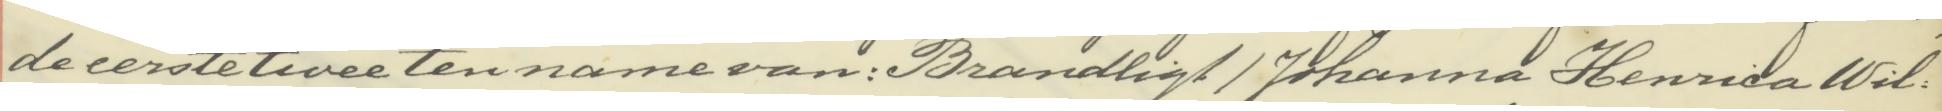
de eerste twee ten name van: Brandligt / Johanna Henrica Wil=
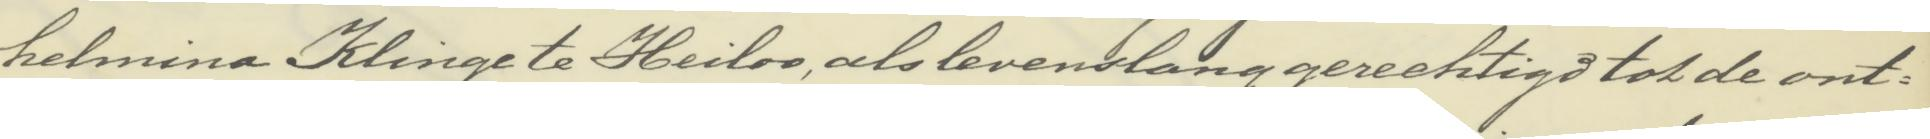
helmina Klinge te Heiloo, als levenslang gerechtigd tot de ont=
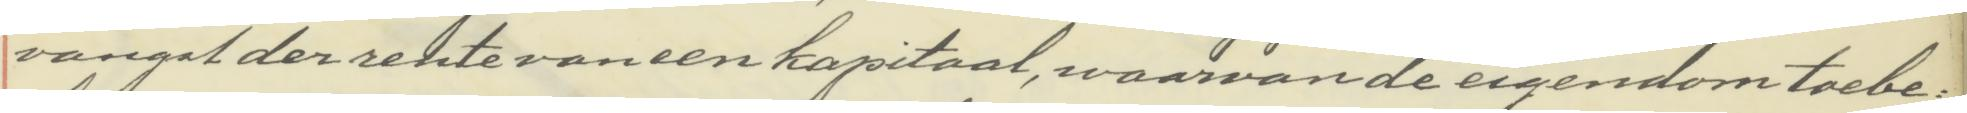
vangst der rente van een kapitaal, waarvan de eigendom toebe=
